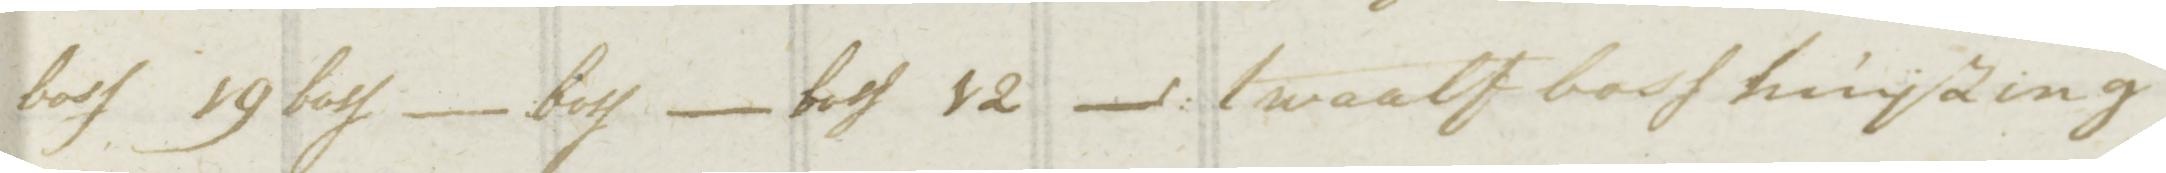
boss 19 — boss— boss boos 12 —: twaalf boss huijzing
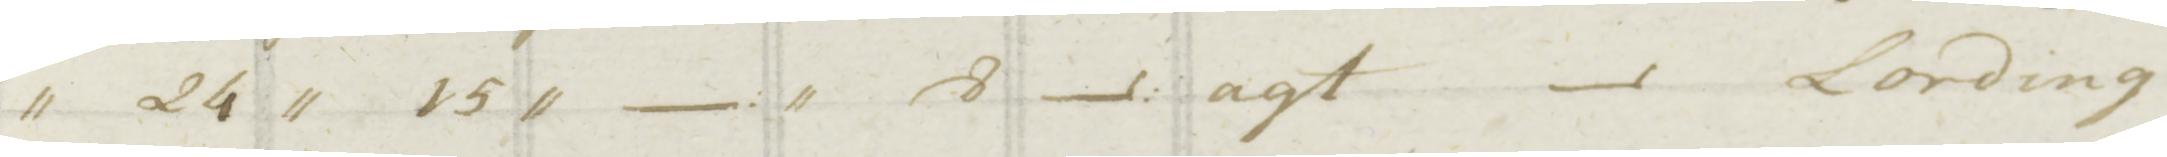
„ 24 „ 15 „— „ 8 —: ' agt —: Lording
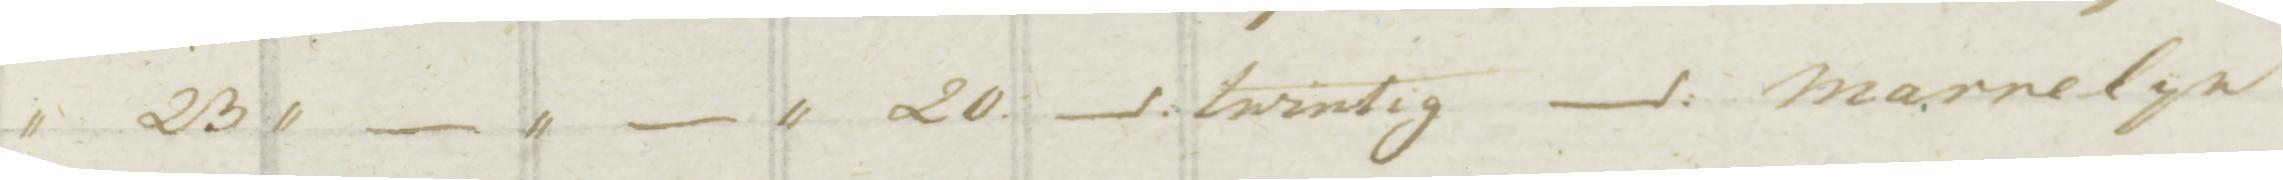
„ 23 „ „ „ 20 —: twintig —: Marrelijn
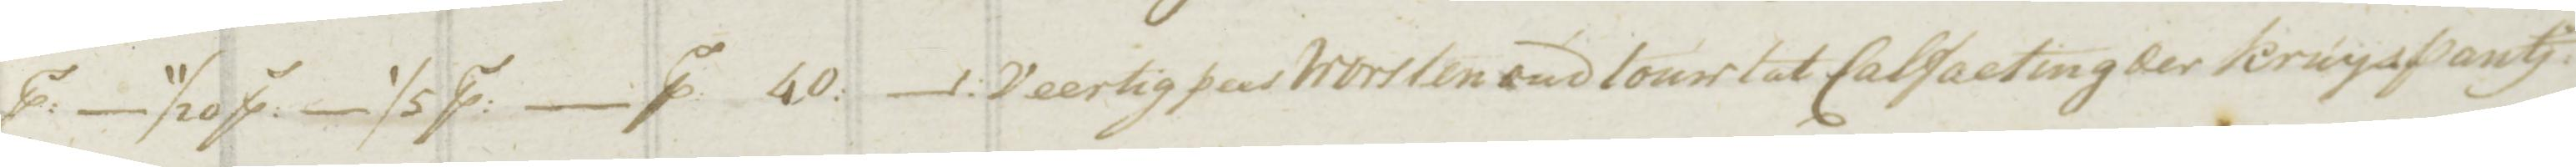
p:s —11/20 p:s— 1/5 p:s —p:s 40: —: Veertig pees Worsten oud touw tot Calfaeting der Kruijspantj:s
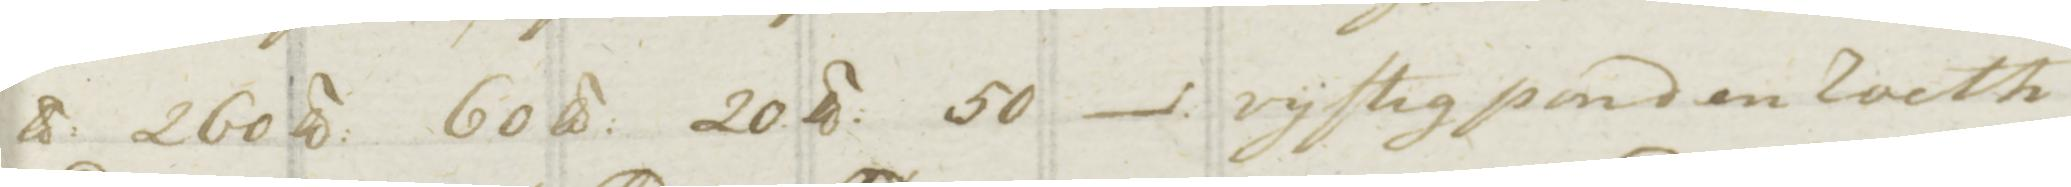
lb: 260 lb: 60 lb: 20. lb: 50 —: vijftig pond en roeth
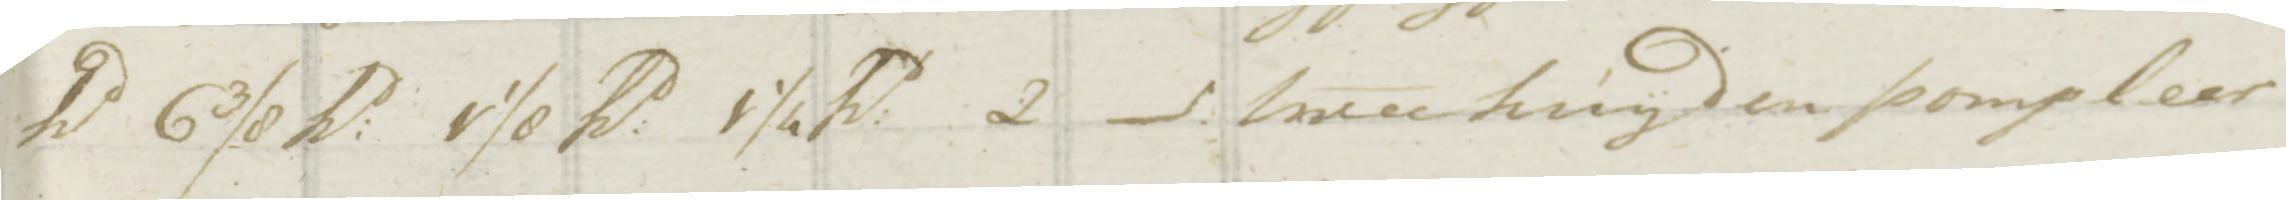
h: d 6 3/8 h:d 1 1/8 h:d 1¼ h:d 2 —: twee huijden pompleer
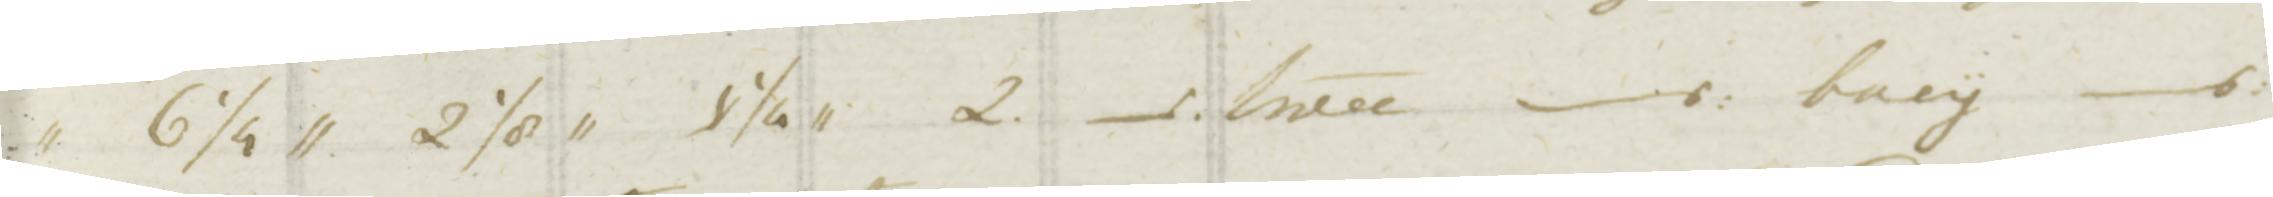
„ 6¼ „ 2 1/8 „ 1¼ „ 2. —: twee —: baeij —s:
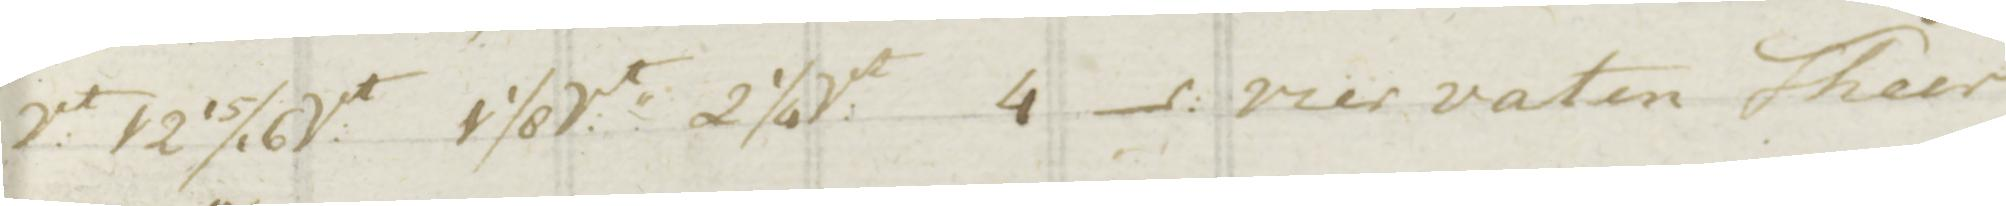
V:t 12 15/16 V:t 1 1/8 V:t 2¼ V:t 4 —: vier vaten Theer
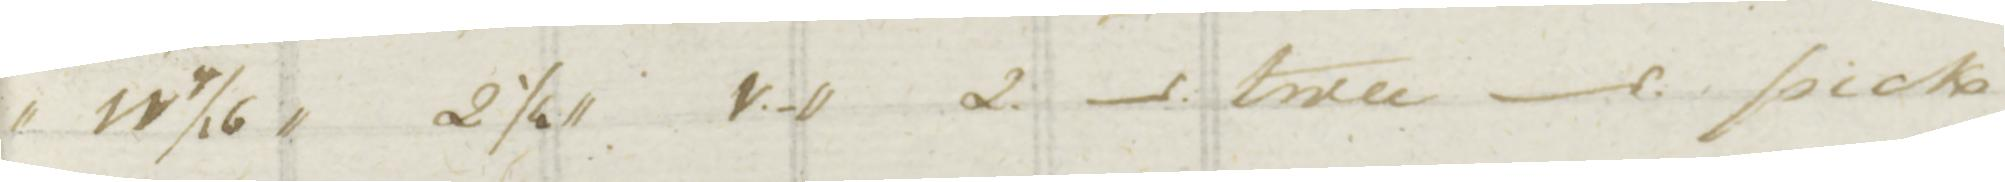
„ 11 4/16 „ 2¼ „ 1.-„ 2. —: twee —: pick
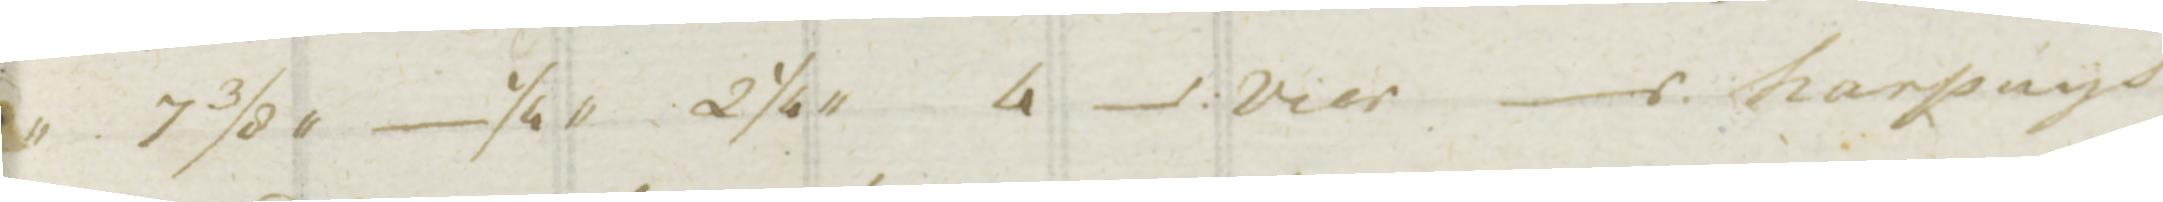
„ 7 3/8 „ —¼„ 2¼ „ 4 _—: vier —: harpuijs
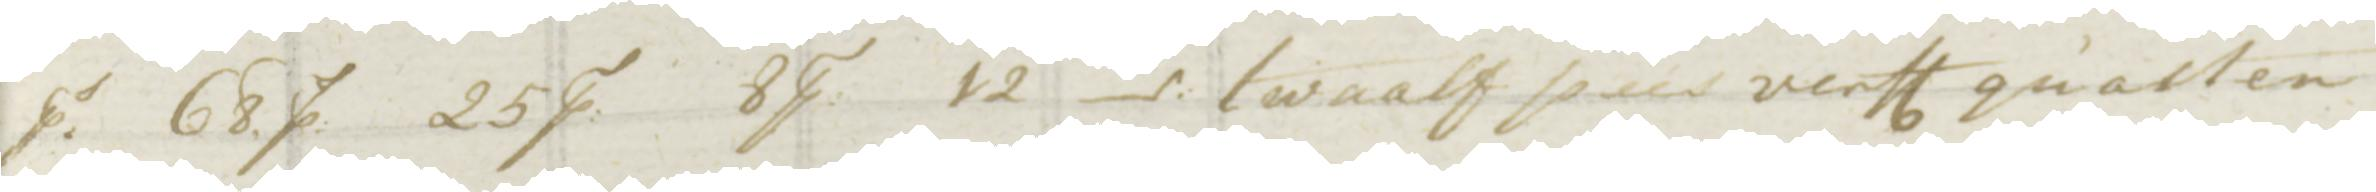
p:s 68. p:s 25 p:s 8 p:s 12 —: twaalf pees verff quasten
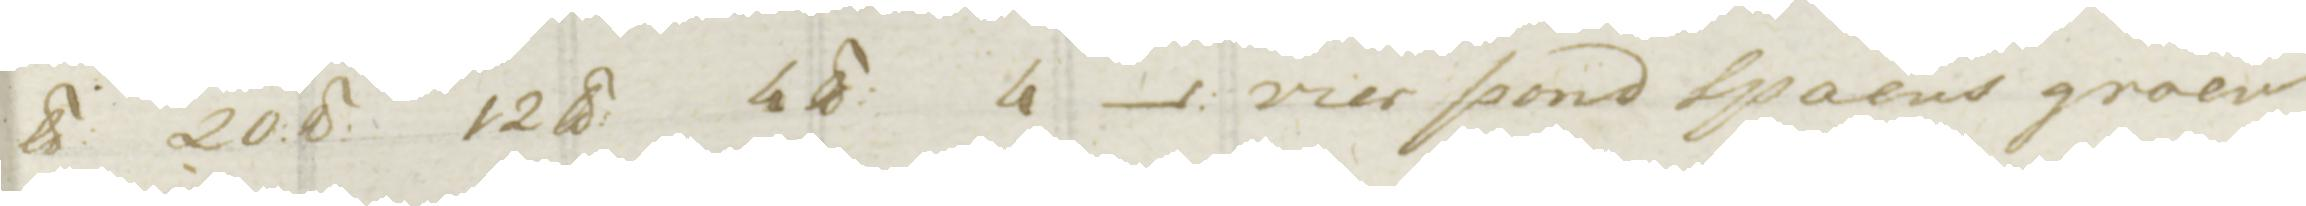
lb: 20:lb: 12 lb: 4 lb: 4 —: vier pond Spaens groen
